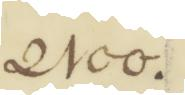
2100.
